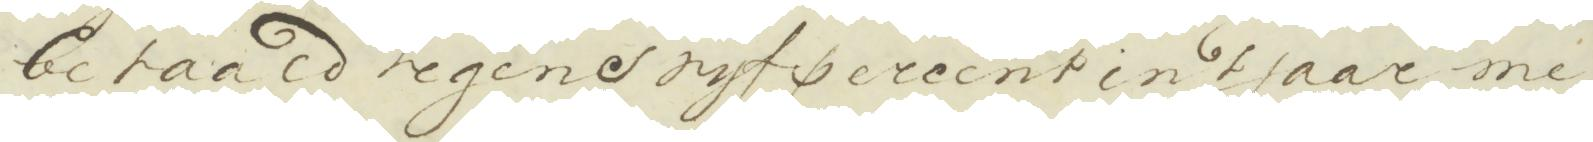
betaald tegens vyf percent in 't jaar, me
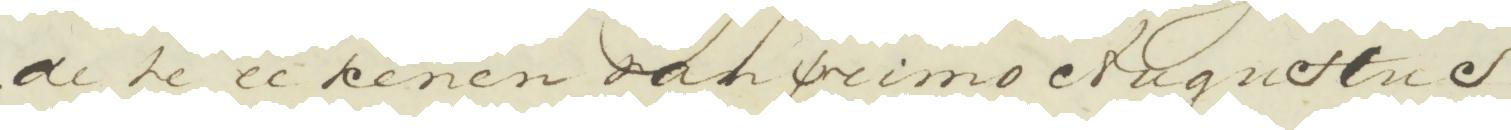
„de te rekenen van primo Augustus
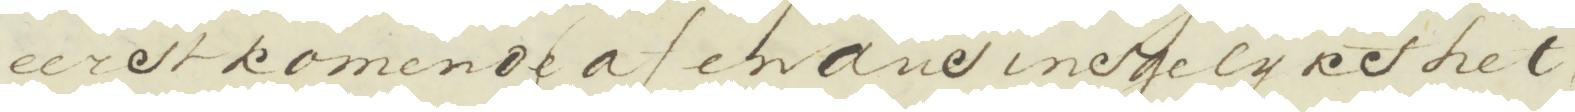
eerstkomende af en dus insgelyks het
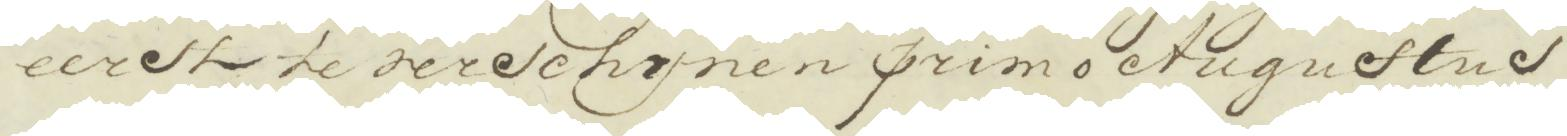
eerst te verschynen primo Augustus
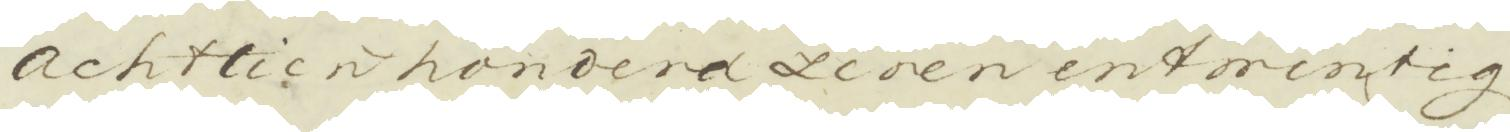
achttien honderd zeven en twintig
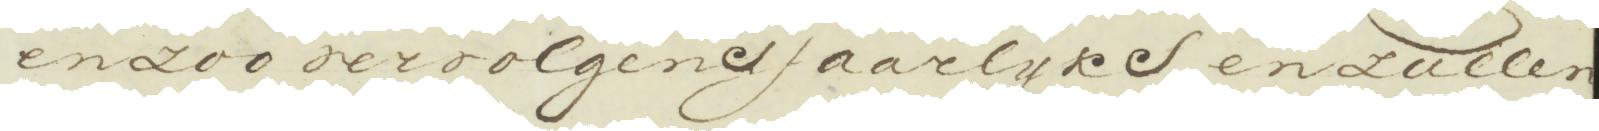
en zoo vervolgens jaarlyks, en zullen
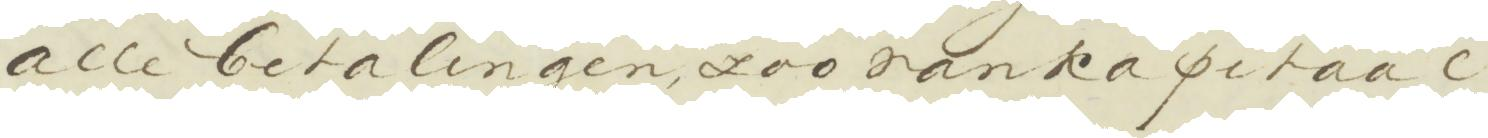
alle betalingen, zoo van kapitaal
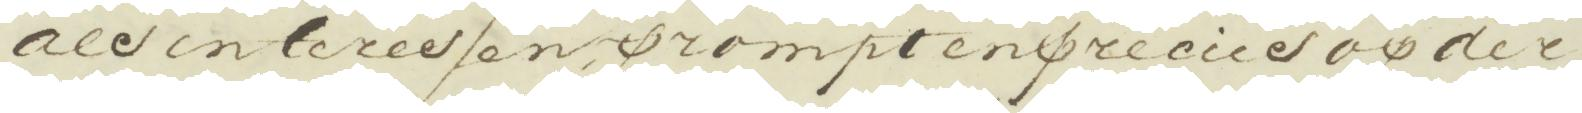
als interessen, prompt en precies op der
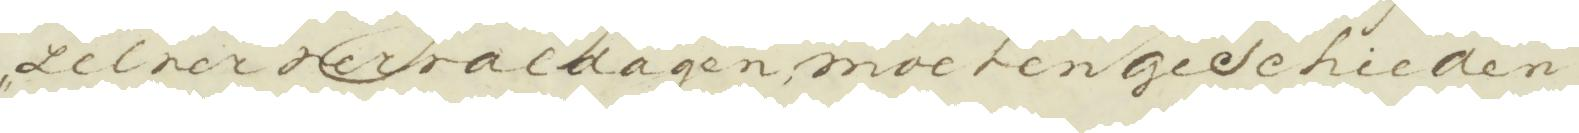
„zelver vervaldagen, moeten geschieden
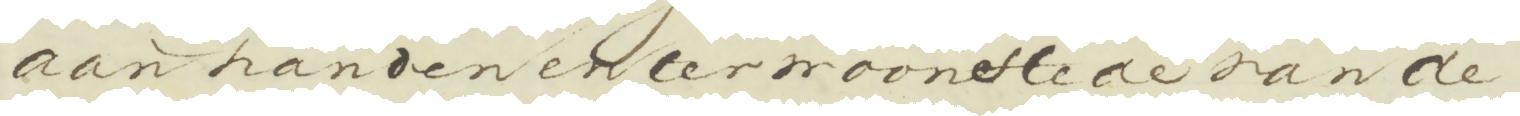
aan handen en ter woonstede van de
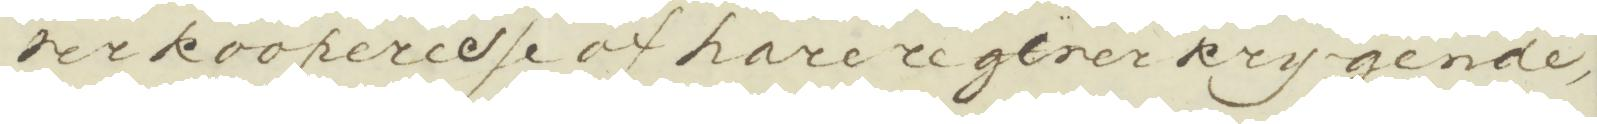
verkooperesse of hare regtverkrygende,
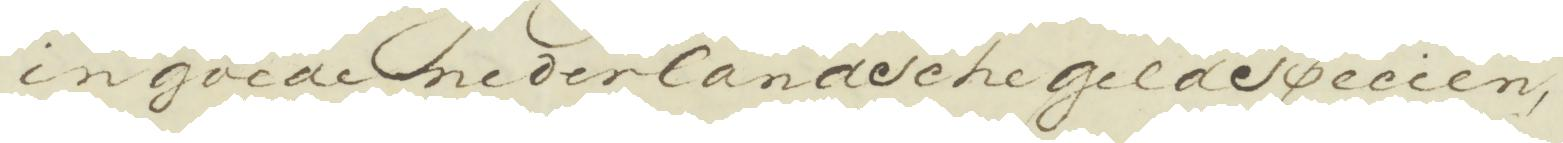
in goede nederlandsche geldspecien,
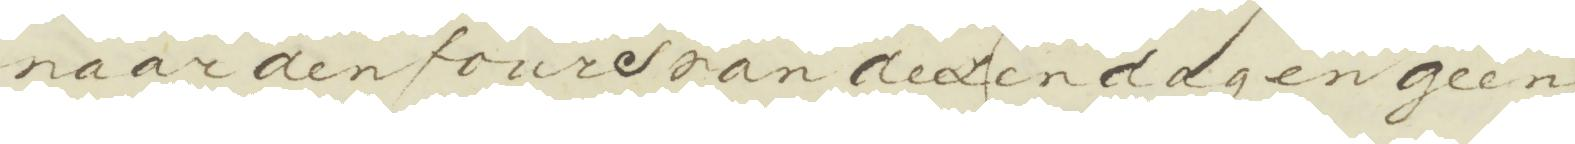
naar den Cours van dezen dag en geen
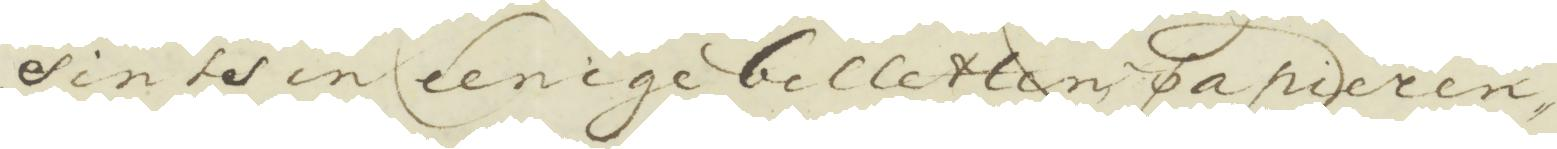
„sints in eenige billetten, papieren„
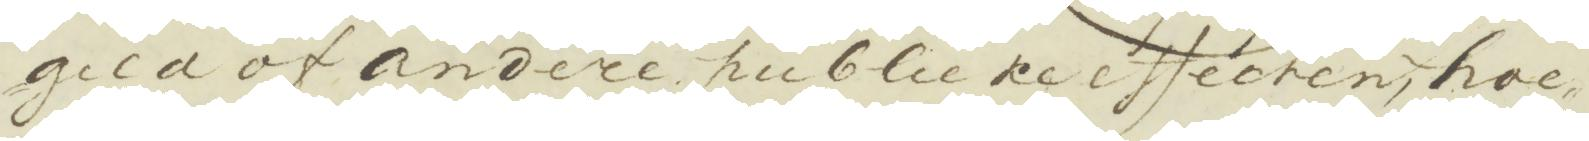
geld of andere publieke effecten, hoe„
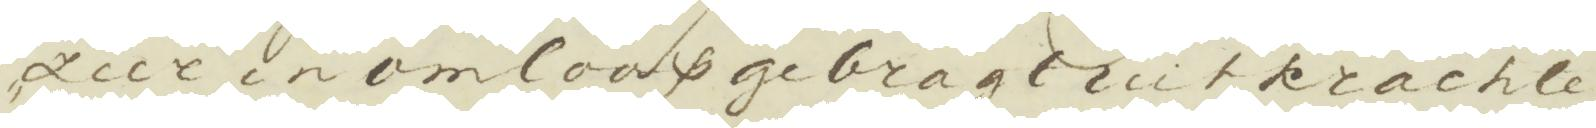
„zeer in omloop gebragt uitkrachte
